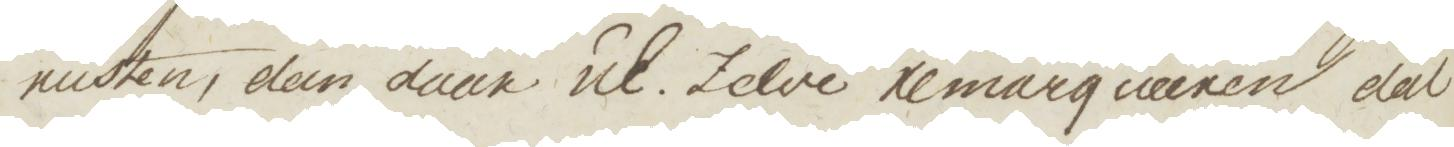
„rusten, dan daar uE. zelve remarqueeren dat
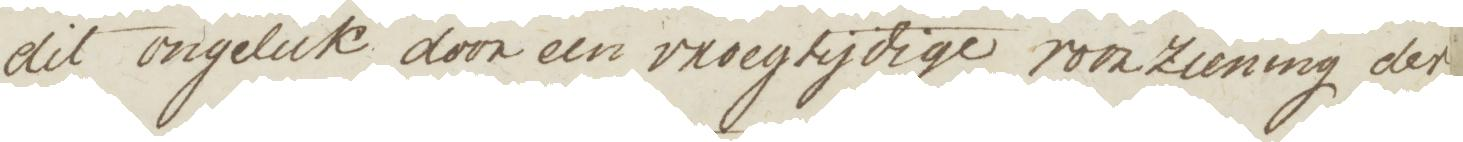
dit ongeluk door een vroegtijdige voorziening der
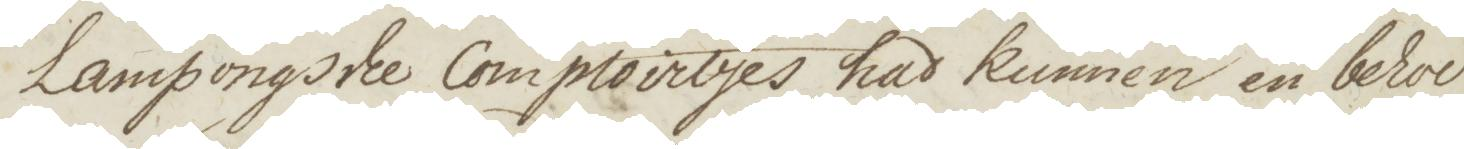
Lampongsche comptoirtjes had kunnen en behoe
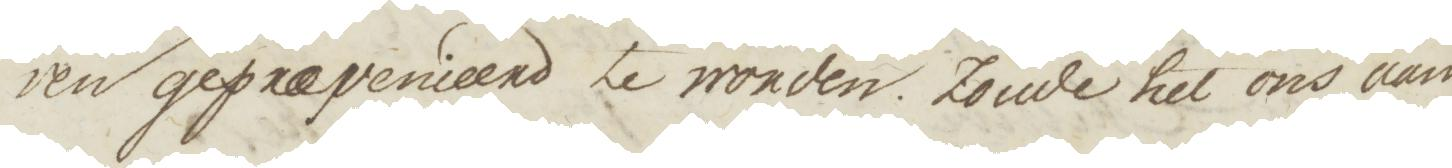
ven gepraevenieerd te worden. zoude het ons aan
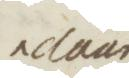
^daar
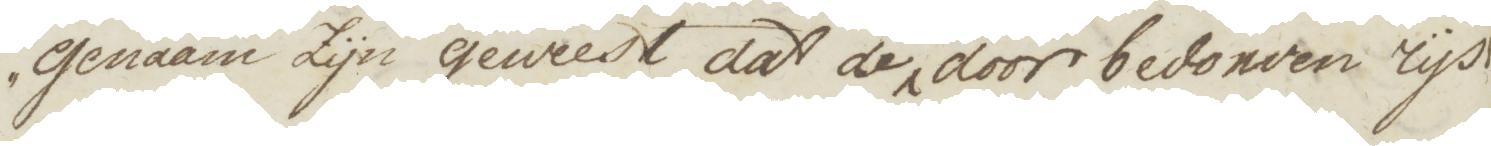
„genaam zijn geweest dat de ^ door bedorven rijs
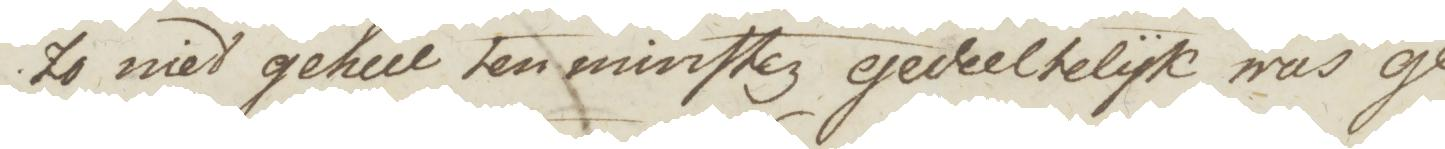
zo niet geheel ten minsten gedeeltelijk was ge
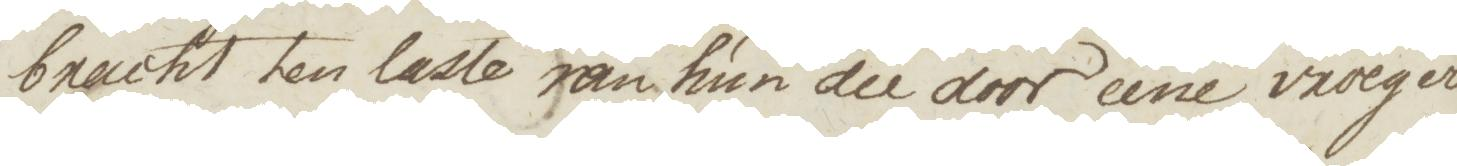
bracht ten laste van hun die door eene vroeger
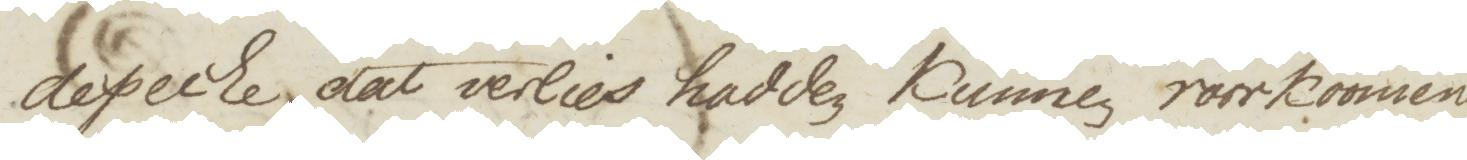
depeche dat verlies hadden kunnen voorkoomen
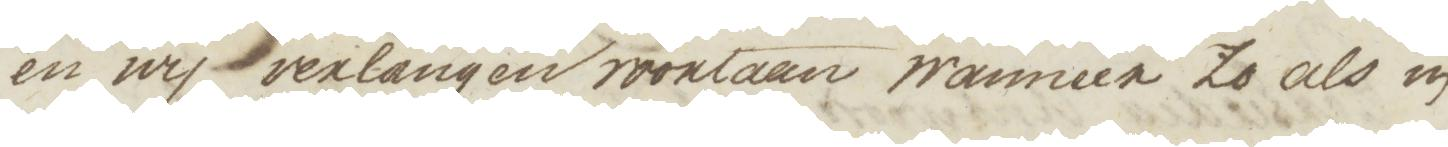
en wij verlangen voortaan wanneer zo als in
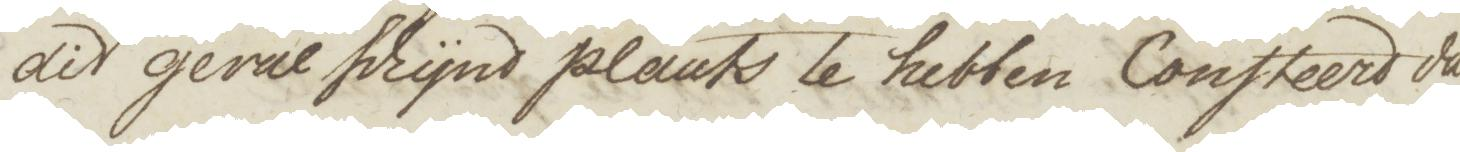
dit geval schijnd plaats te hebben Consteerd da
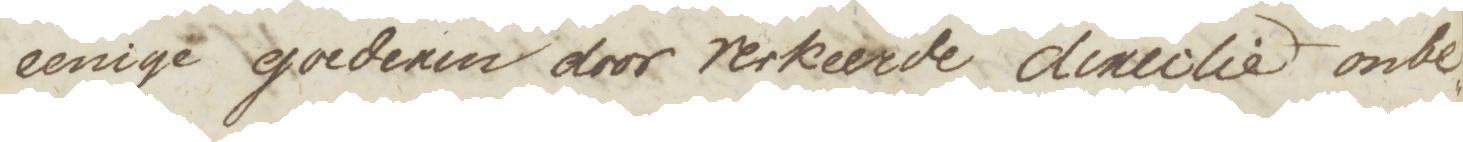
eenige goederen door verkeerde directie onbe
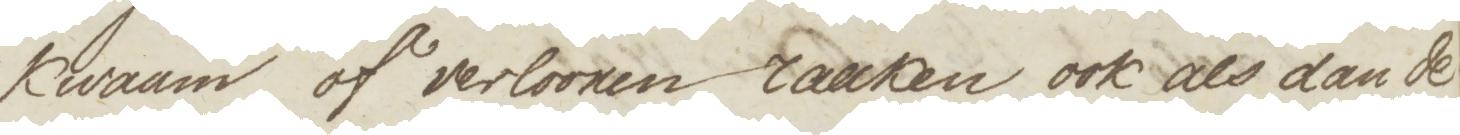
kwaam of verlooren raaken ook als dan de
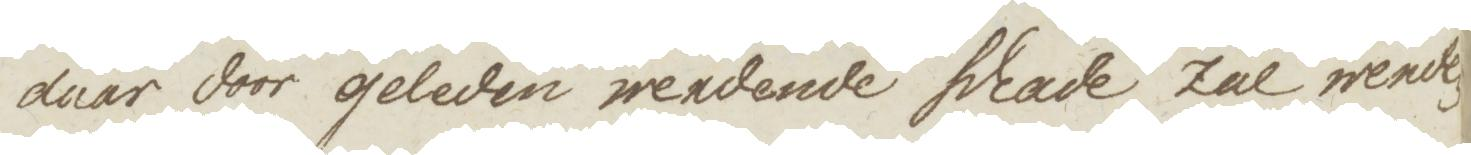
daar door geleden werdende schade zal werden
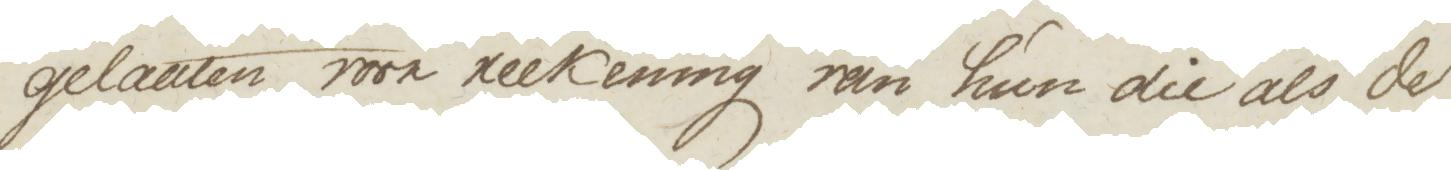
gelaaten voor reekening van hun die als de
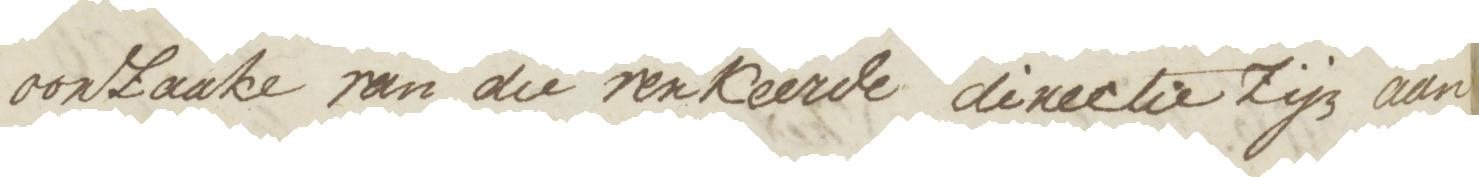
oorzaake van die verkeerde directie zijn aan
